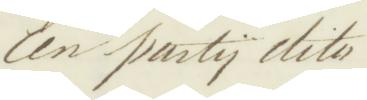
Een partij dito
